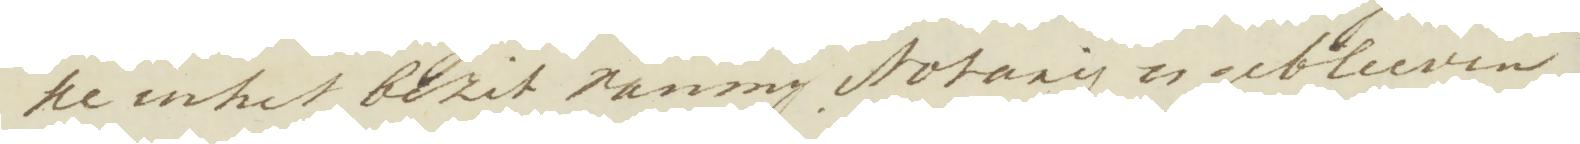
ke in het bezit van my Notaris is gebleeven,
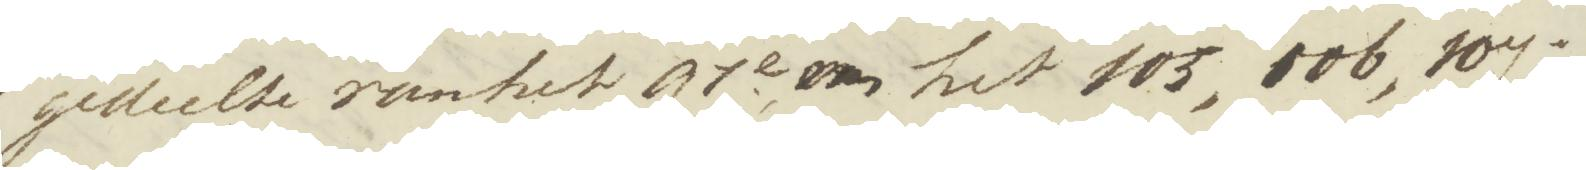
gedeelte van het 97.e en het 103, 106, 107",
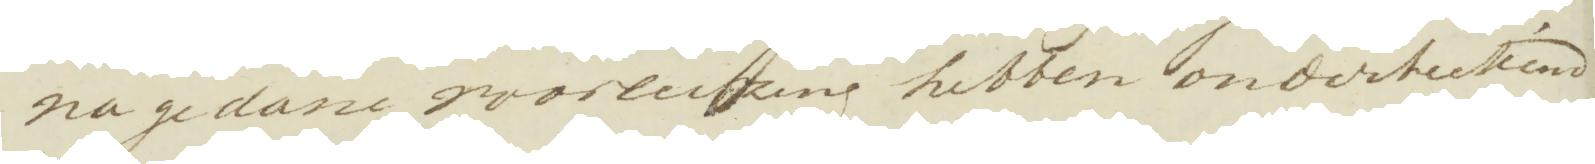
na gedane voorleezing hebben onderteekend
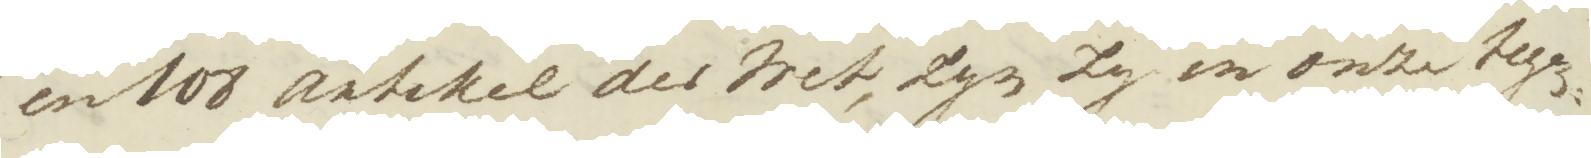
en 108 artikel der wet, zyn zy en onze tegen:
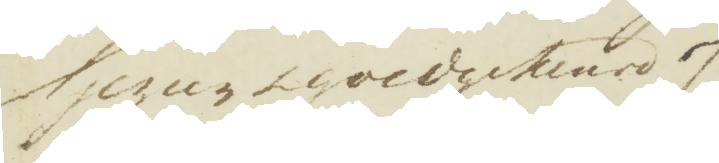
Gezien & goedgekeurd
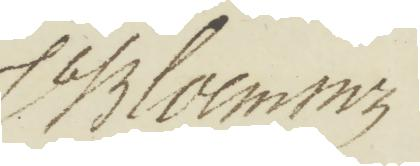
Jb Bloemmz
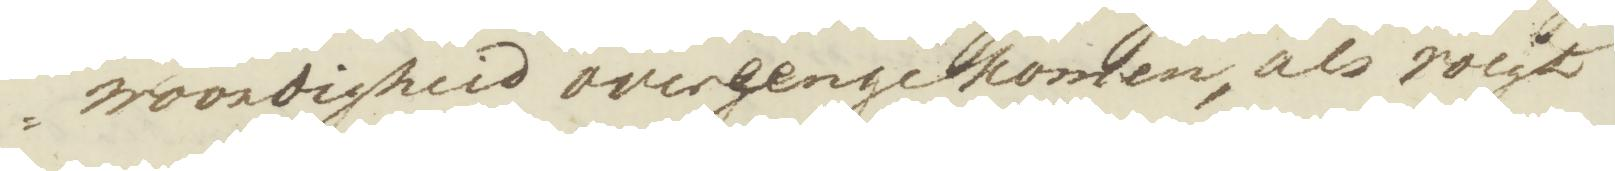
=woordigheid overeengekomen, als volgt
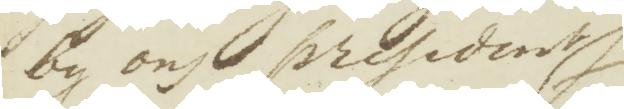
by ons president
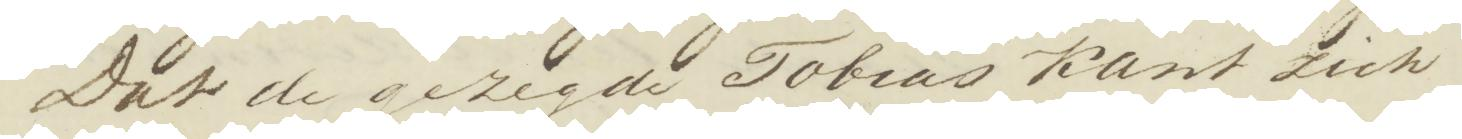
Dat de gezegde Tobias Kant zich
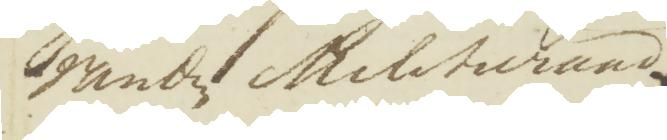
van den Militieraad
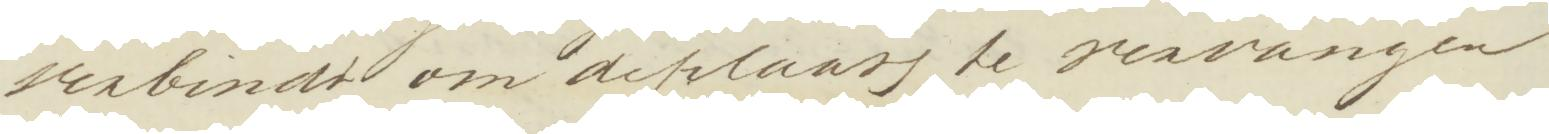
verbindt om dde plaats te vervangen
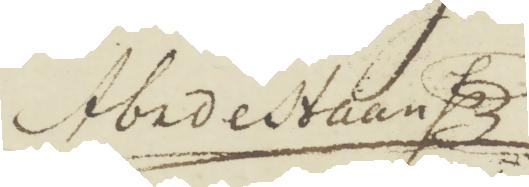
Abr de Haan
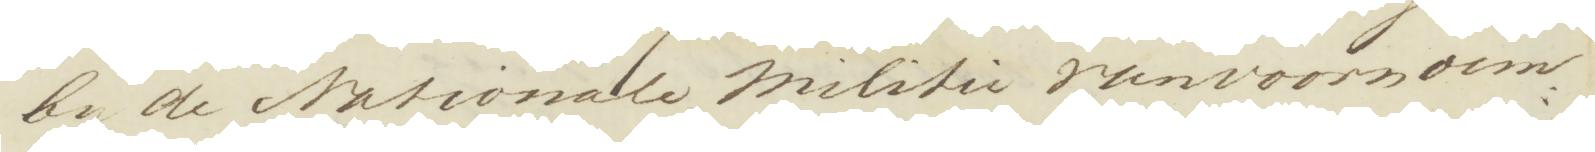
by de Nationale militie van voornoem:
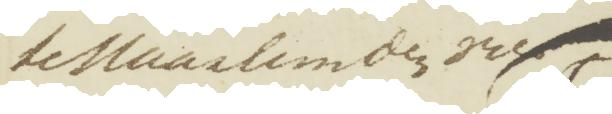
te Haarlem den vier
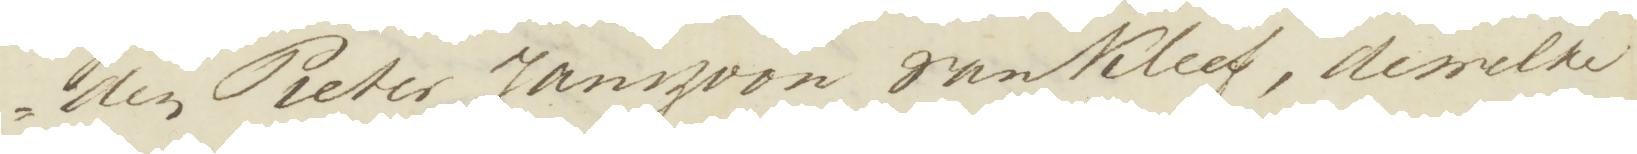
=den Pieter Janszoon van Kleef, dewelke
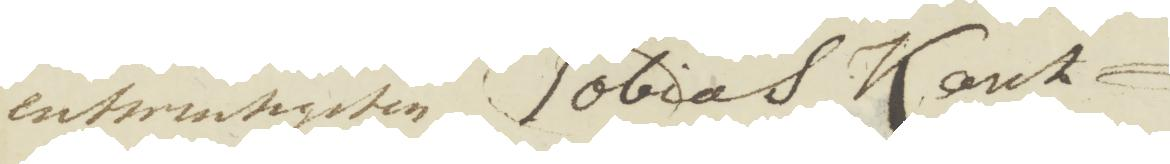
Entwintigsten Tobias Kant
